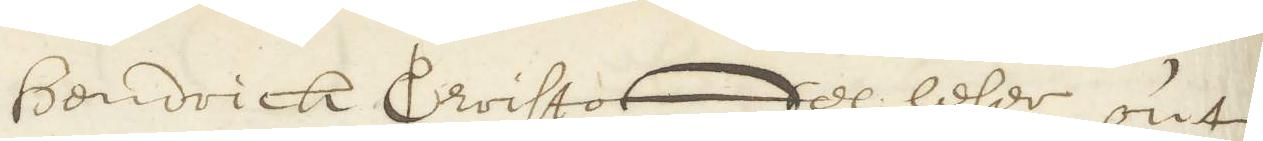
hendrick Cristoffel leser out
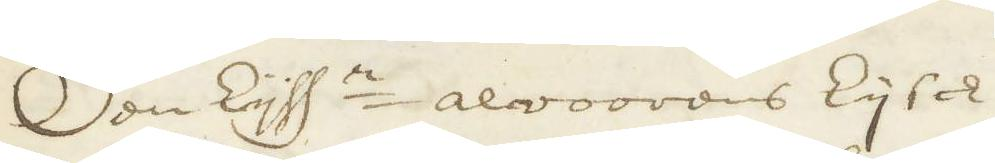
Den Eijss=r alvoorens Eijsch
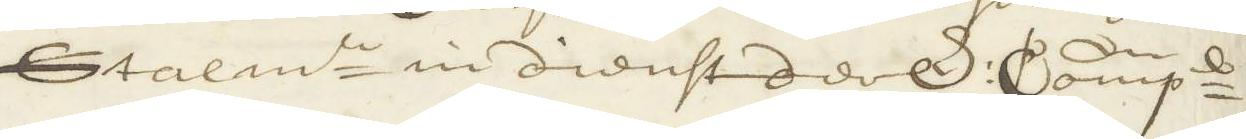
stalm=r in dienst der E: Comp=e
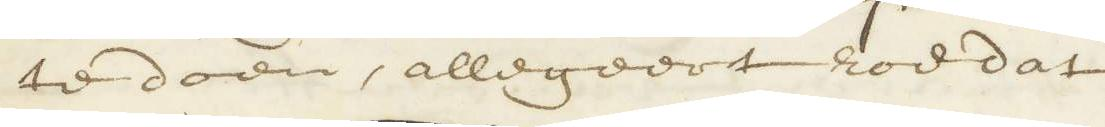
te doen, allegeert hoe dat
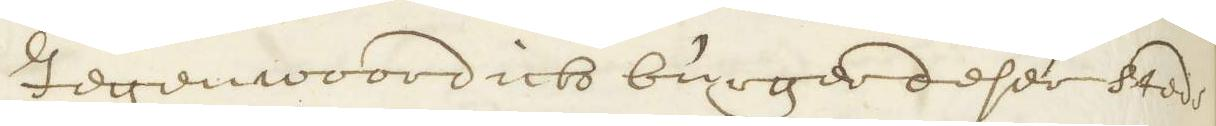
Iegenwoordich burger deser stede
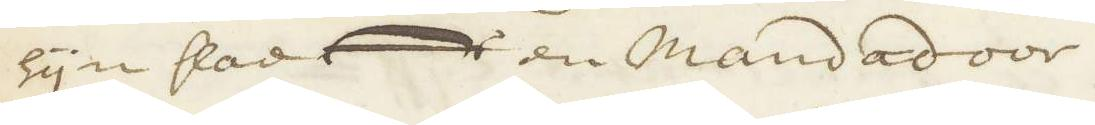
sijn slaeff en mandadoor
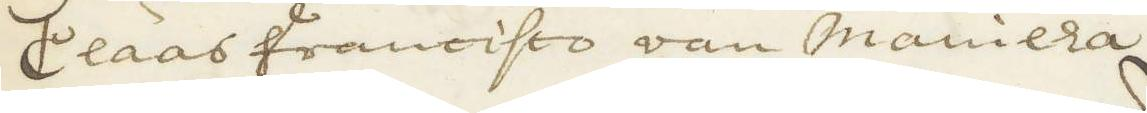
Claas francisco van manilla
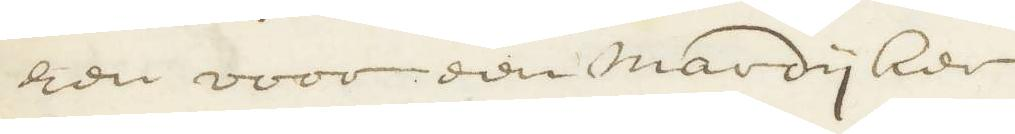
hen voor een mardijker
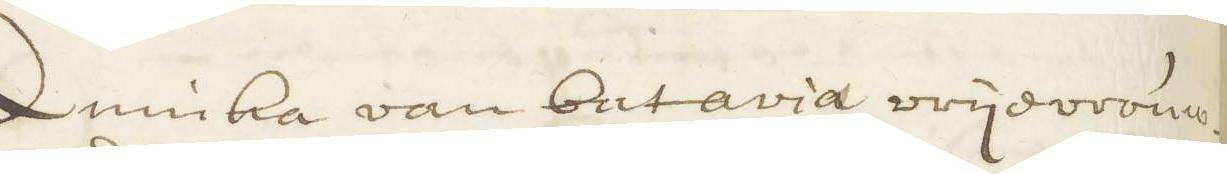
Annika van batavia vrijevrouw
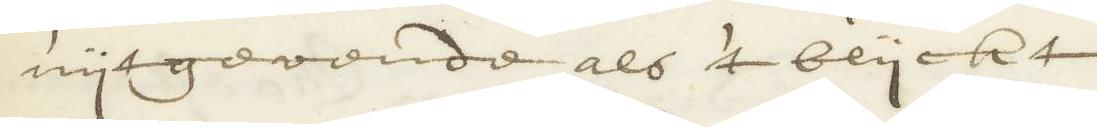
uijtgevende als ’t blijckt
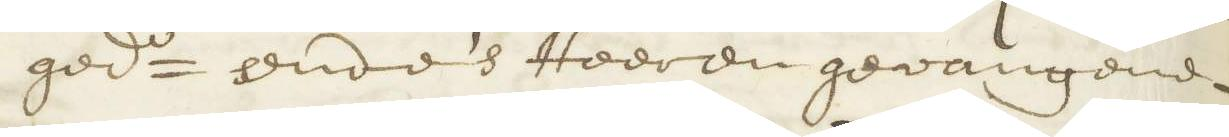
ged=e ende 's Heeren gevangene
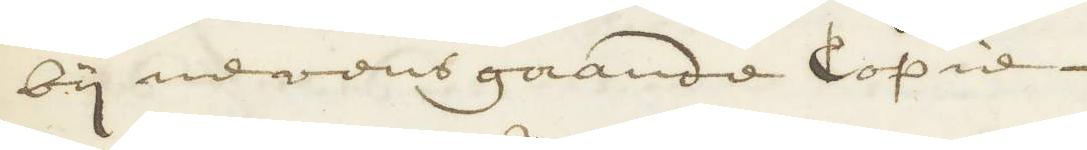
bij nevens gaande Copie
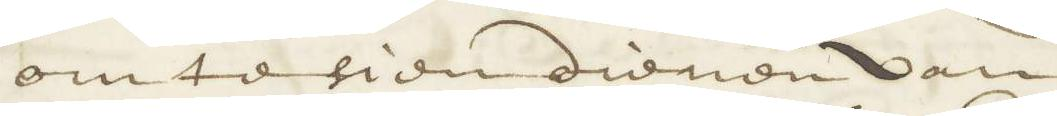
om te sien dienen van
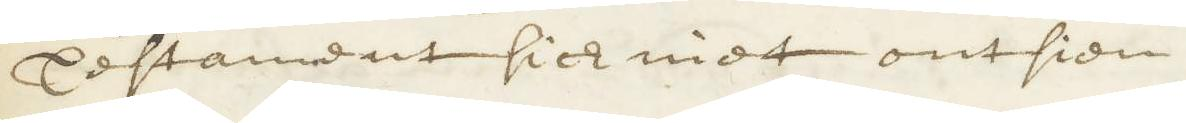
Testament sich niet ontsien
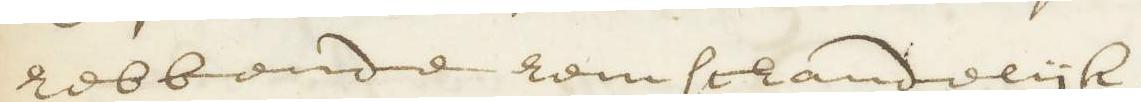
hebbende hem schandelijk
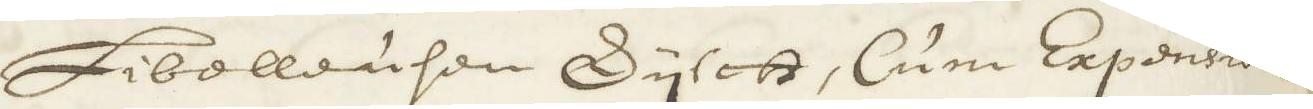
Libelleusen Eijsch, Cum Expensis:
